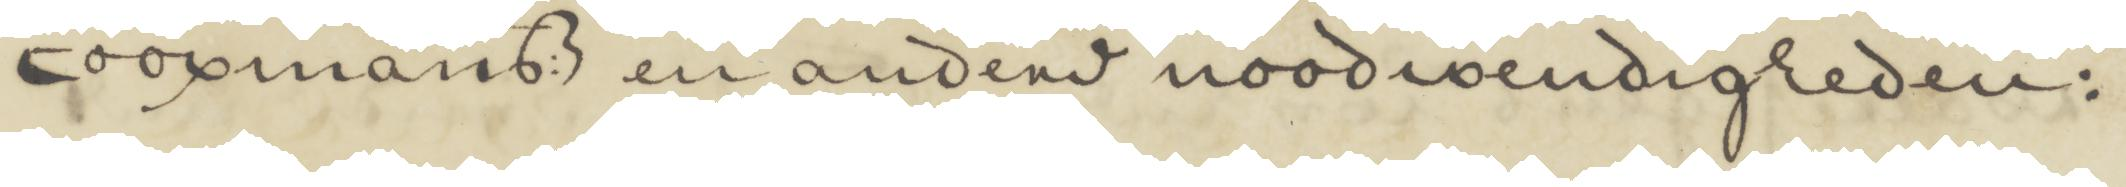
coopmans: en andere nood wendigheden:
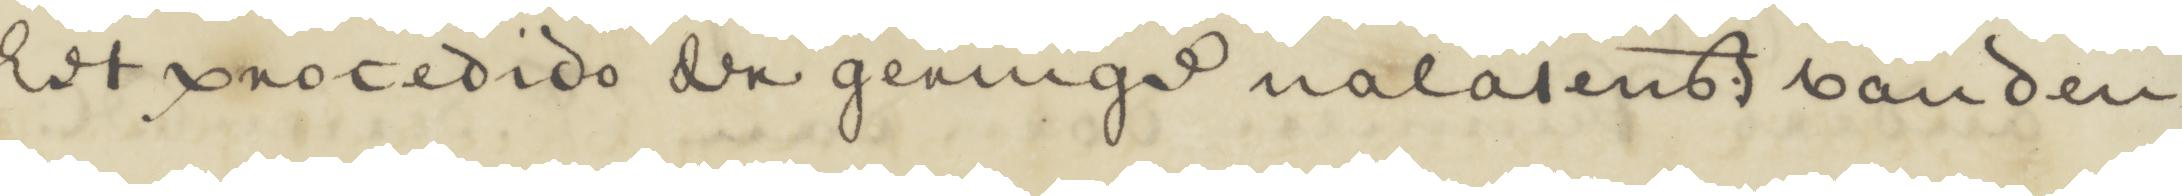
het procedido der geringe nalatens: van den
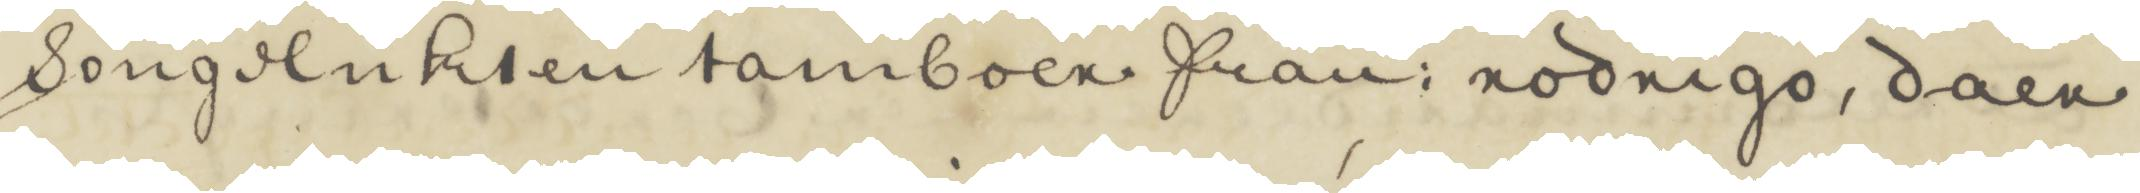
verongelukten tamboer fran:co rodrigo, daer
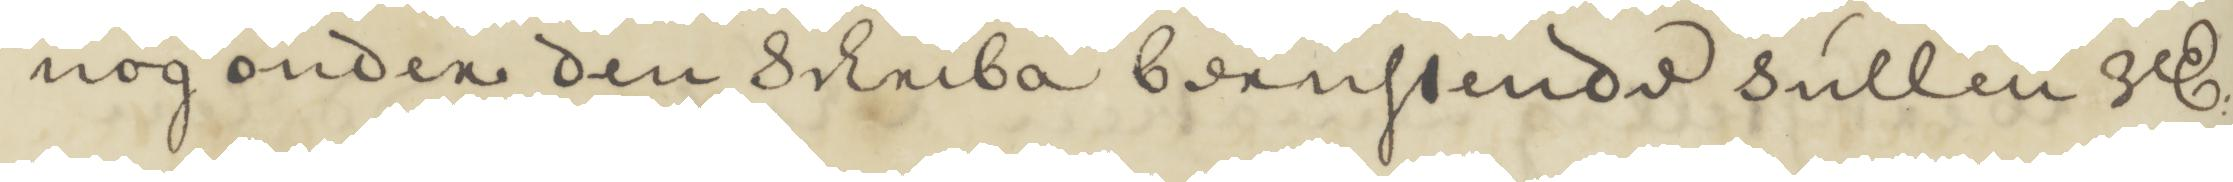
nog onder den schriba berustende sullen VE:
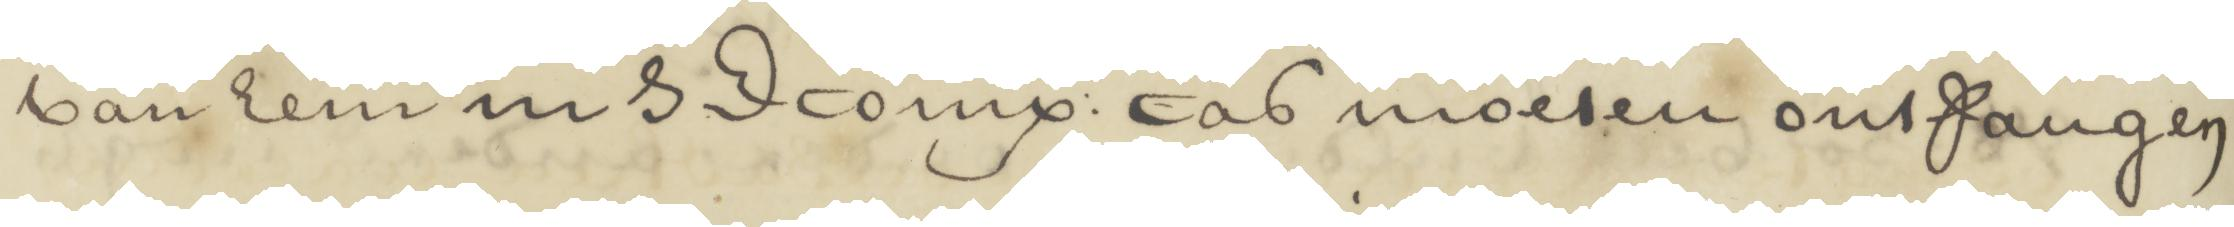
van hem in s E comp: cas moeten ontfangen
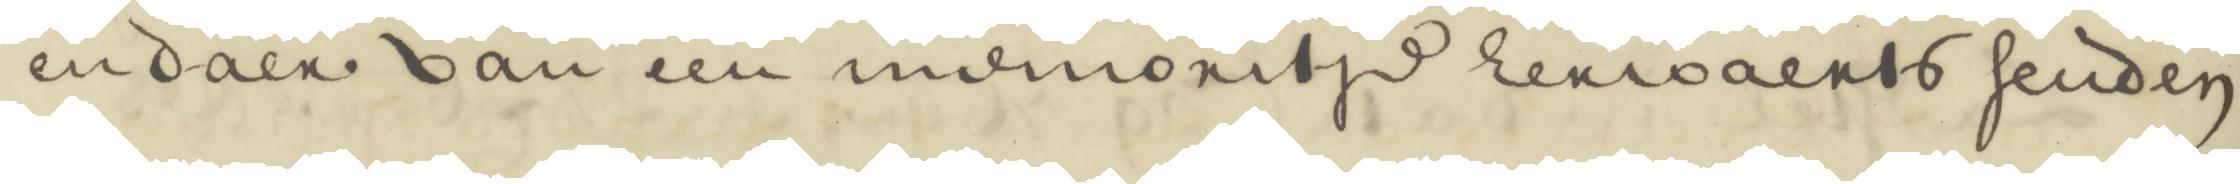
en daer van een memoritje herwaerts senden
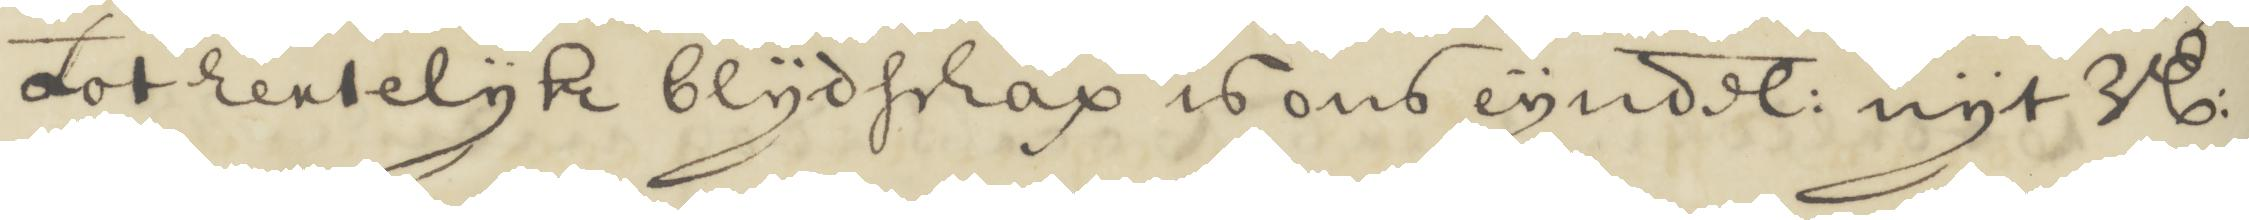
tot hertelijk blijdschap is ons eijndel: uijt VE:
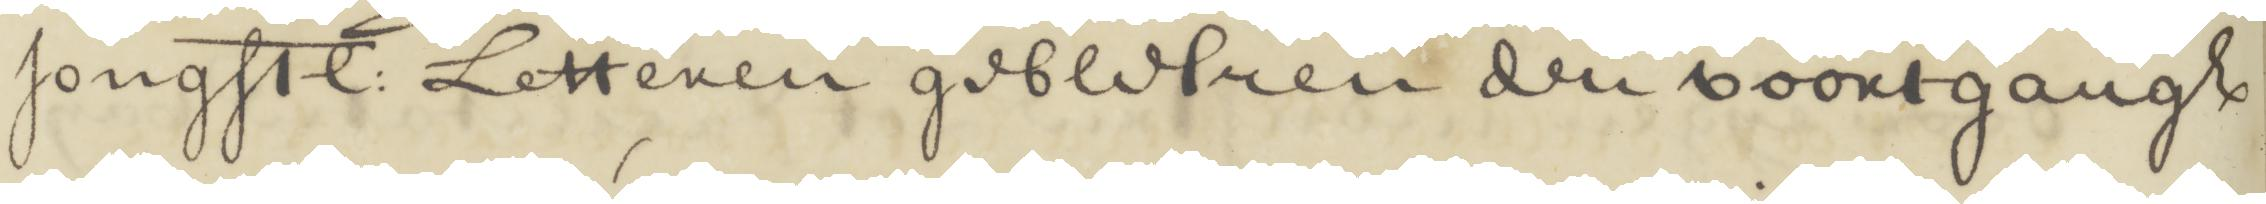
Jongstl: Letteren gebleken den voortgangh
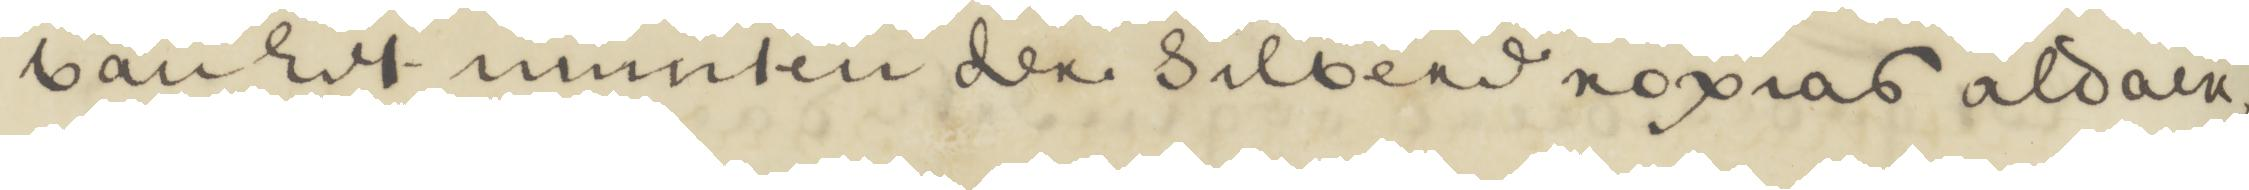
van het munten der silvere ropias aldaer
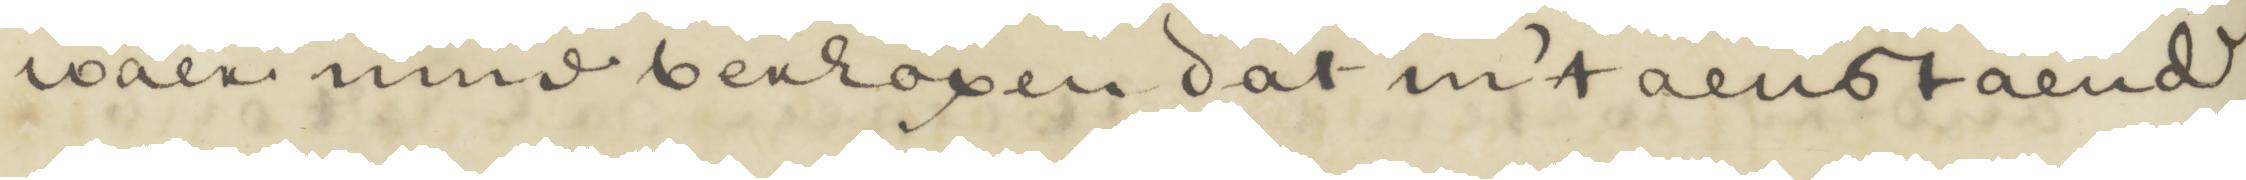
waer inne verhopen dat in ’t aenstaende
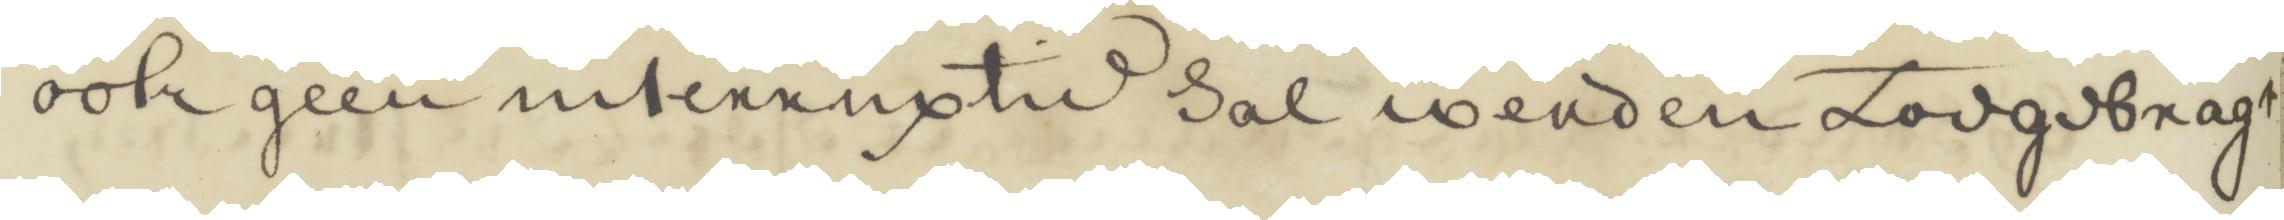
ook geen interruptie sal werden toegebragt
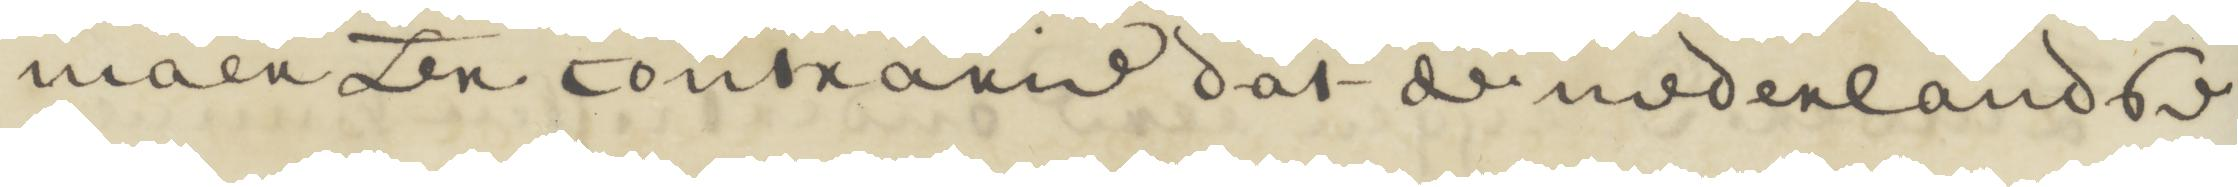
maer ter contrarie dat de nederlandse
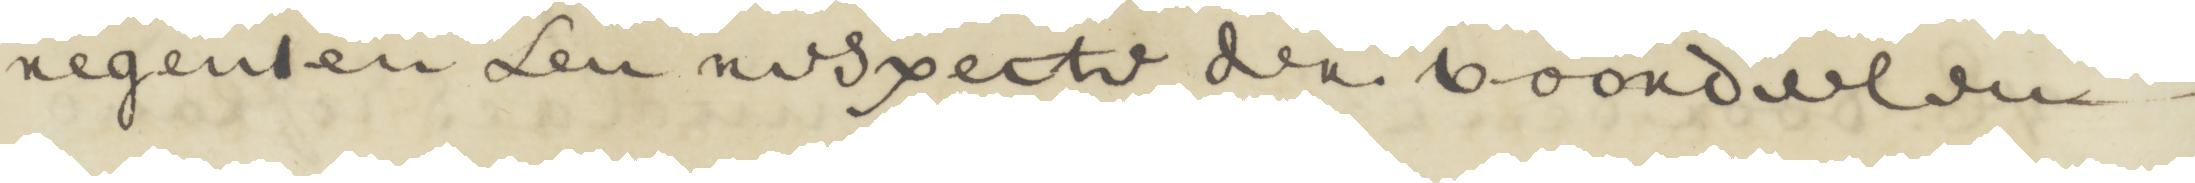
regenten ten respecte der voordeelen
